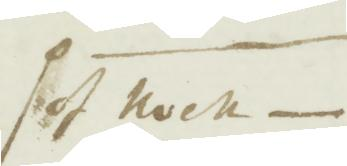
¶of koek —
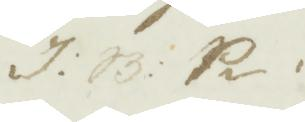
I:B: K.
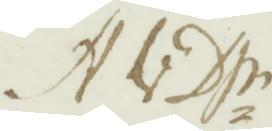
A V DM
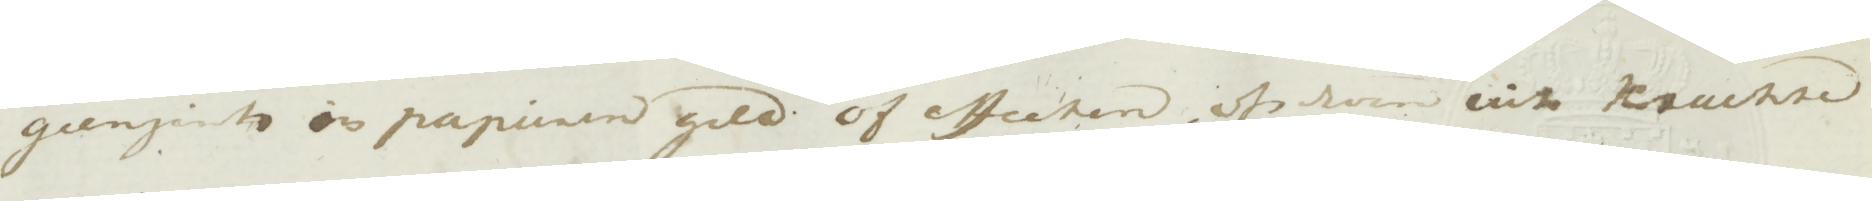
geenzints in papieren geld of effecten, of voor uit krachte
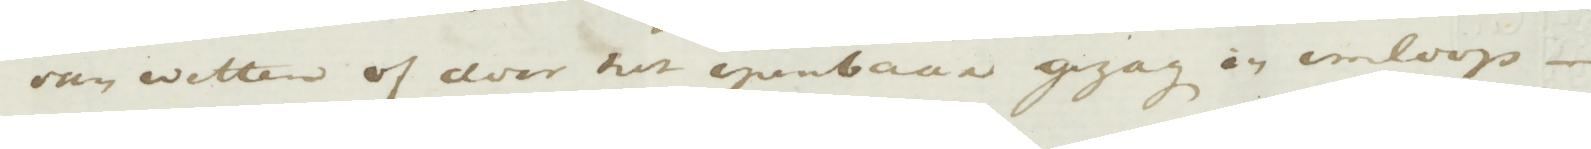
van wetten of door het openbaar gezag in omloop
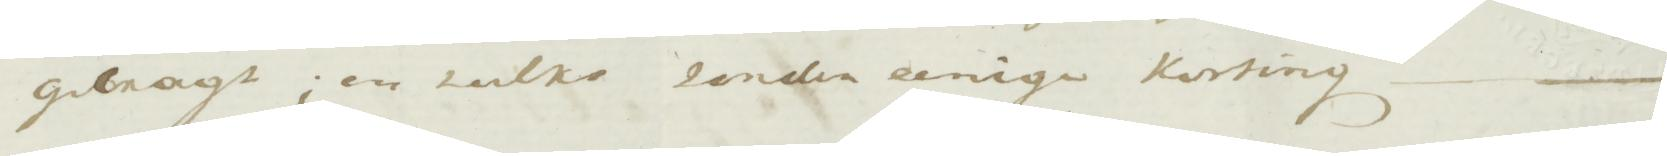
gebragt; en zulks zonder eenige korting
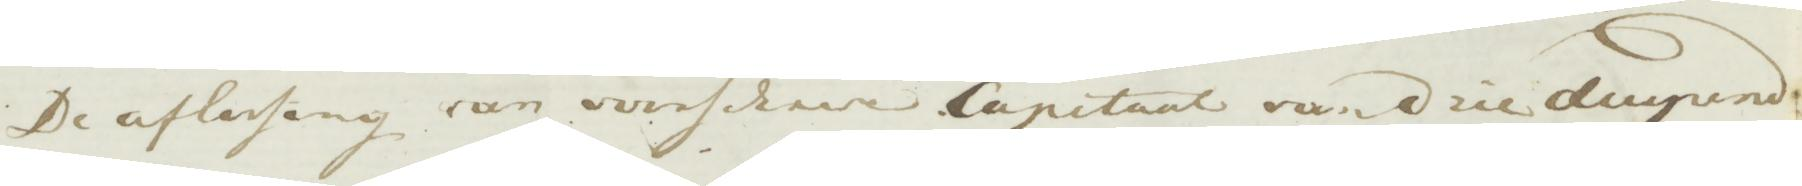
De aflossing van voorschreve Capitaal van drie duyzend
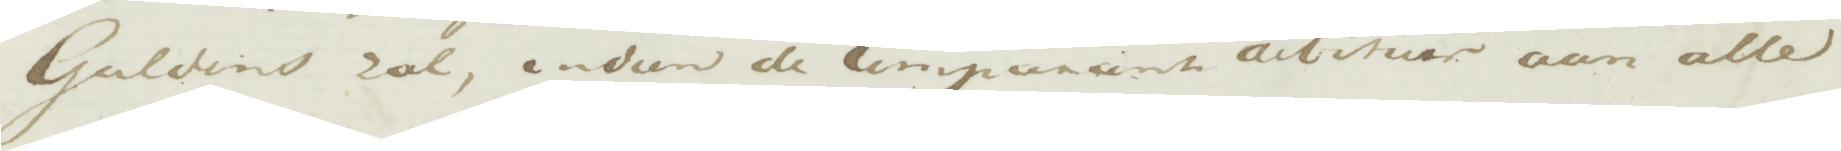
Guldens zal, indien de Comparant debituer aan alle
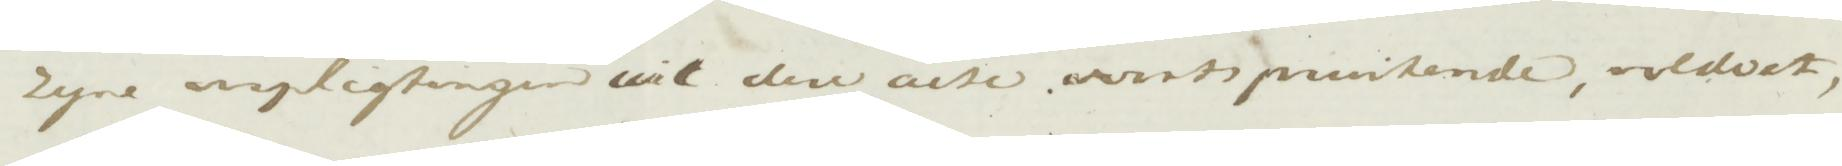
zyne verpligtingen uit den acte voortspruitende, voldoet,
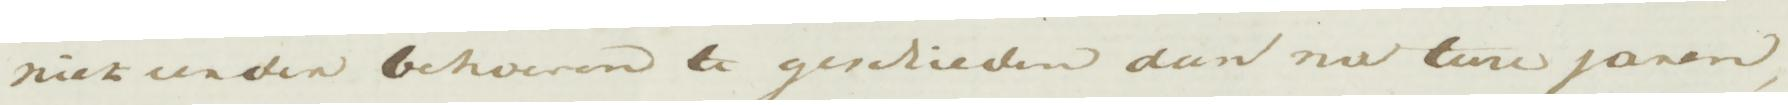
niet eerder behoeven te geschieden dan na twee jaren,
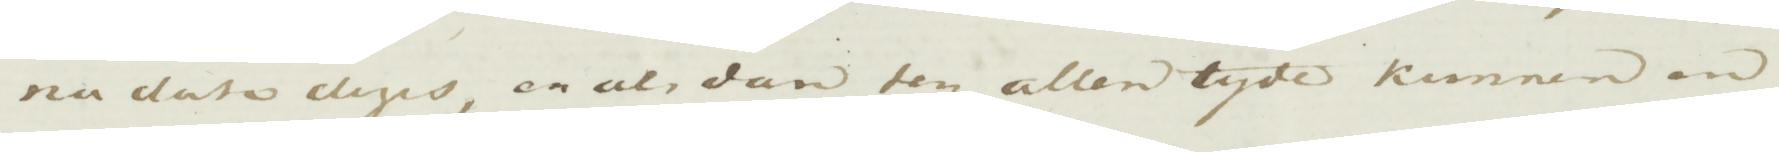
na dato dezes, en als dan ten allen tyde kunnen en
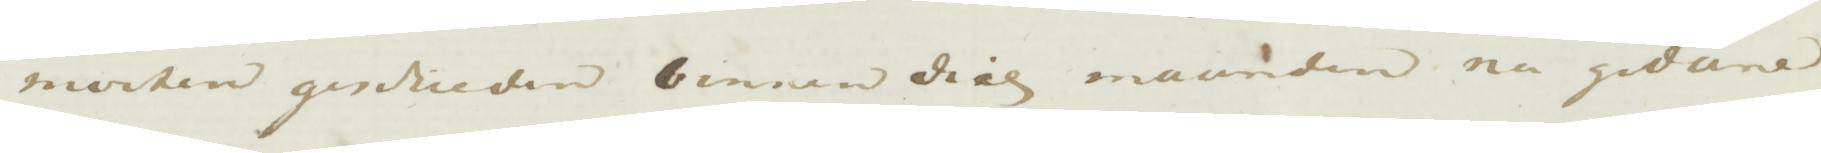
moeten geschieden binnen drie maanden na gedane
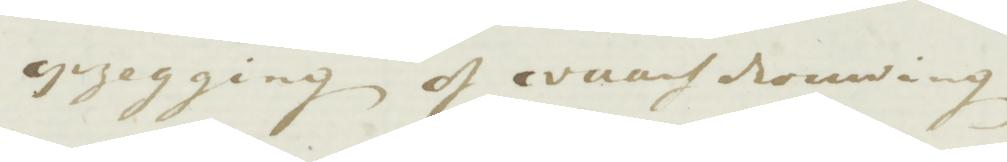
opzegging of waarschouwing
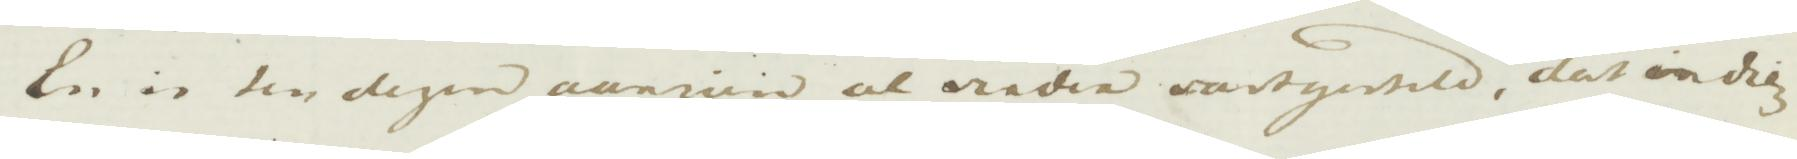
En is ten dezen aanzien al nader vastgesteld, dat in dien
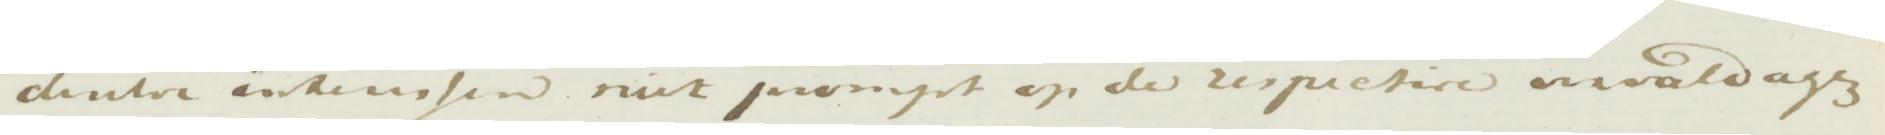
deselve interessen, niet prompt op de respective invaldagen
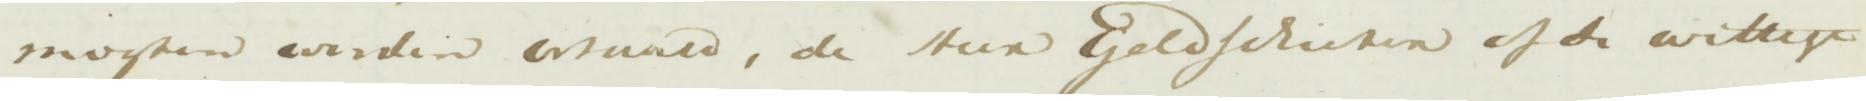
mogten worden betaald, de Heer Geldschieter of de wittige
